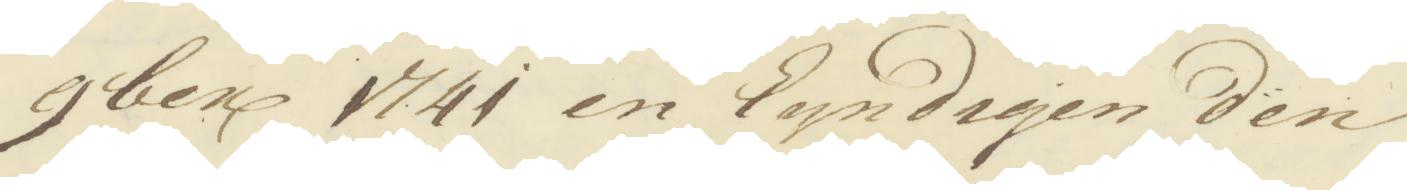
9ber 1741 en Eijndigen den
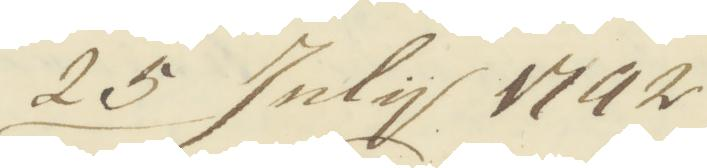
25 Julij 1742
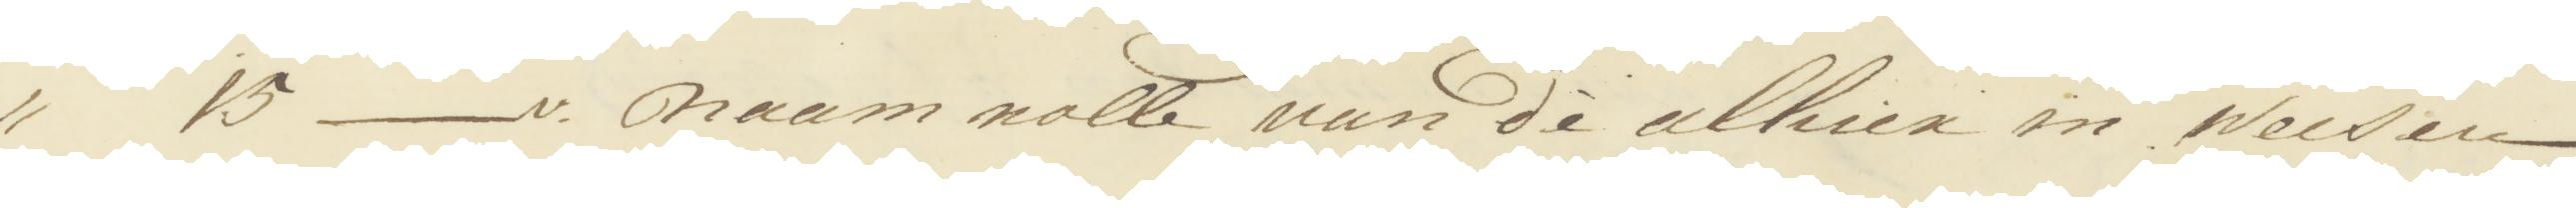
15 _.o naam rolle van de alhier in weesen
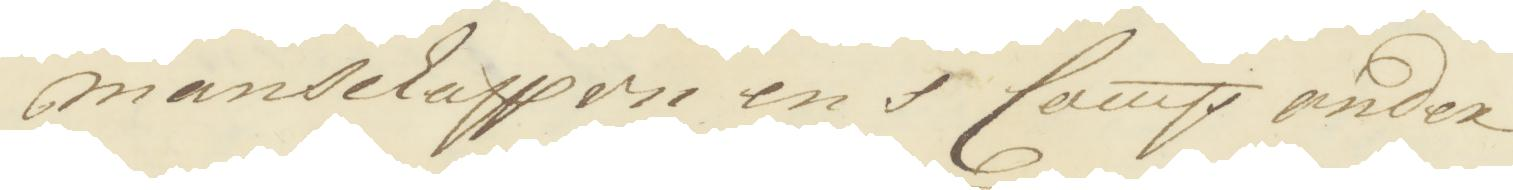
manschappen en ’s Comp onder
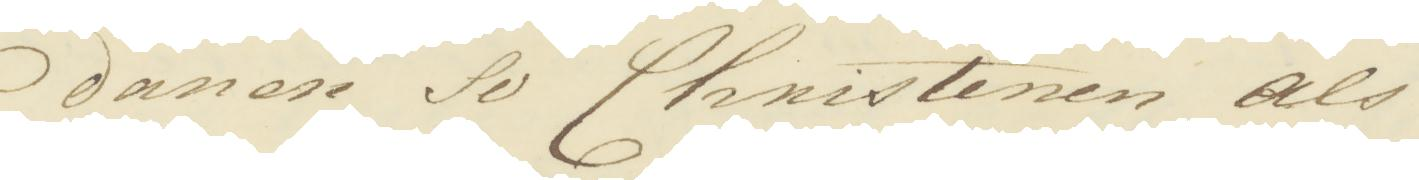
danen so Christenen als
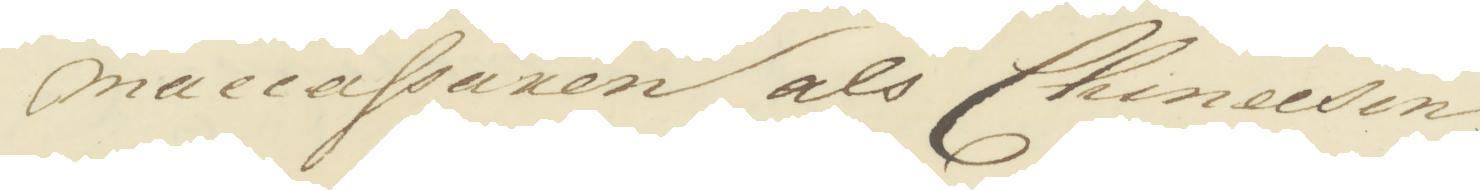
maccassaren als Chineesen
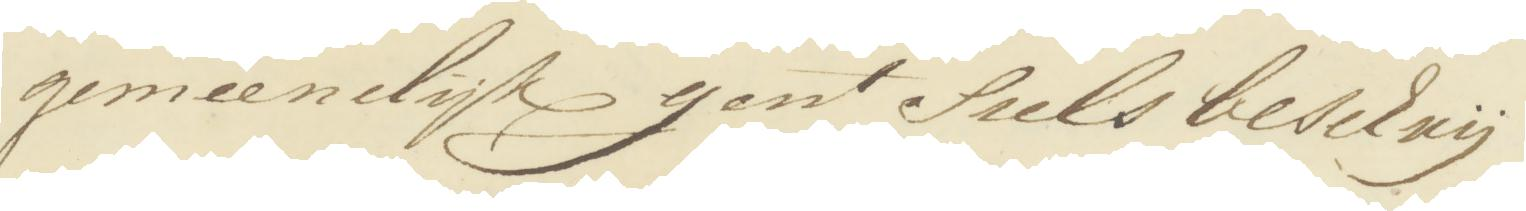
gemeenelijk gent siels beschrij
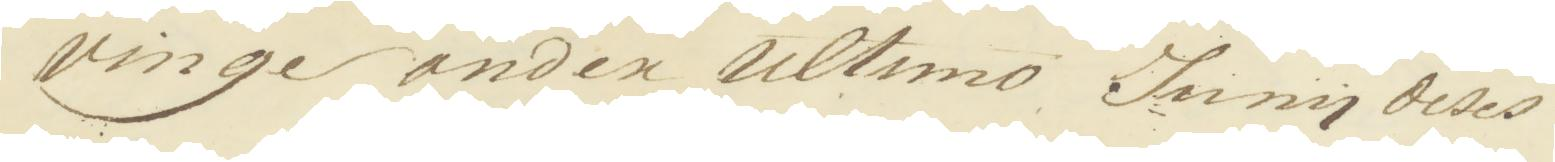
vinge onder ultimo Iunij deses
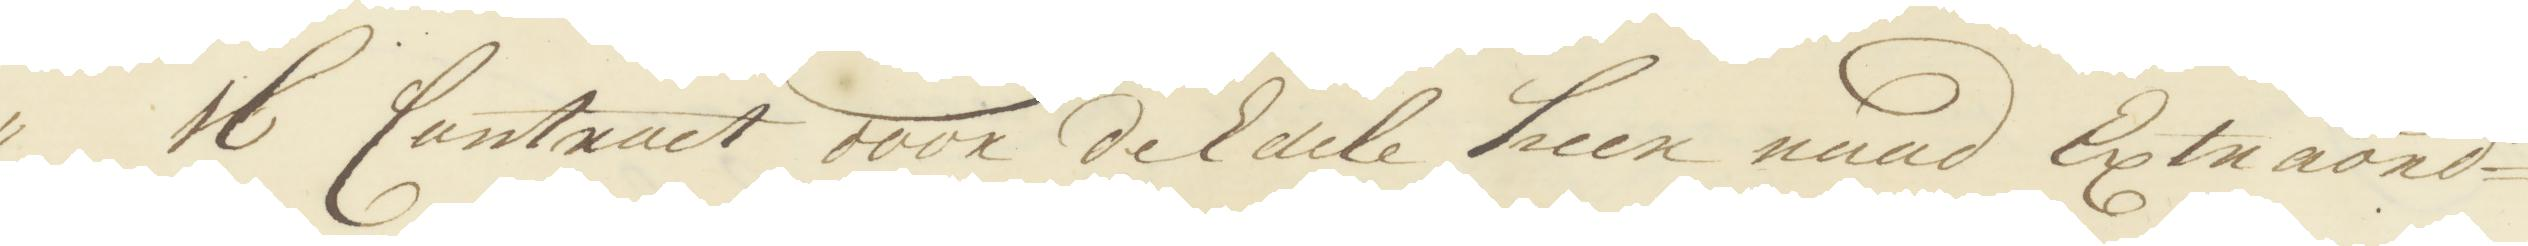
16 Contract door de Edele heer raad Extraord=r
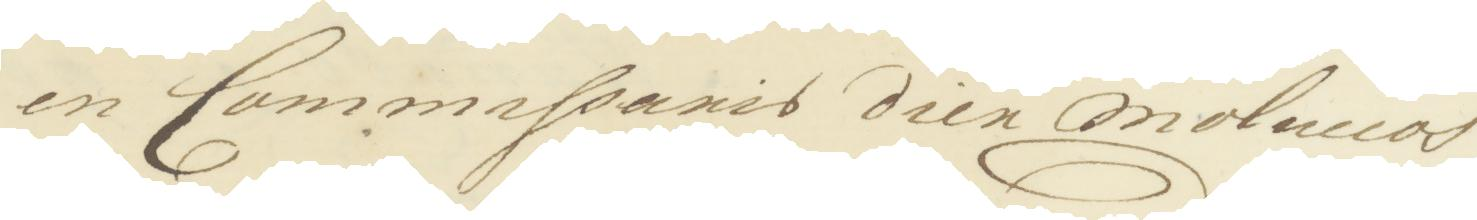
en Commissaris dier moluccos
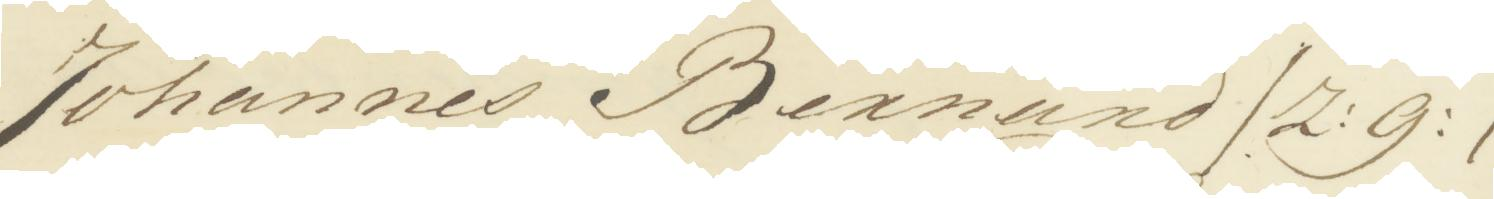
Johannes Bernard /z:g:
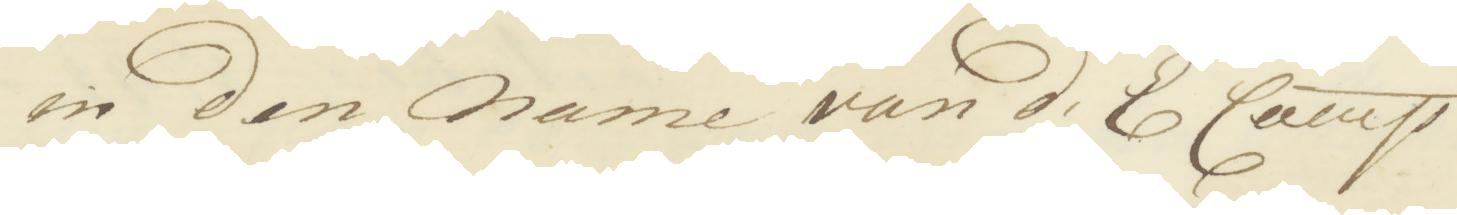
in den name van d' E Comp
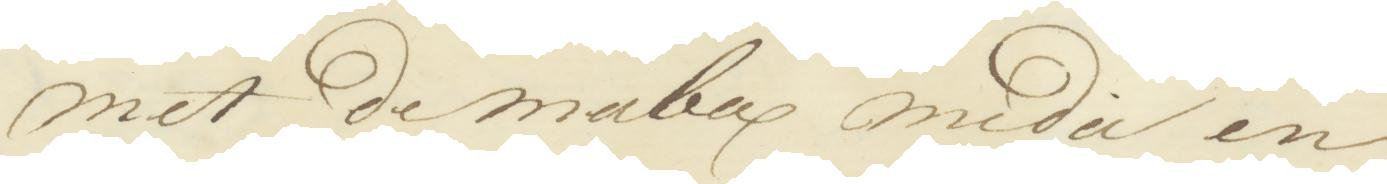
met de maba mida en
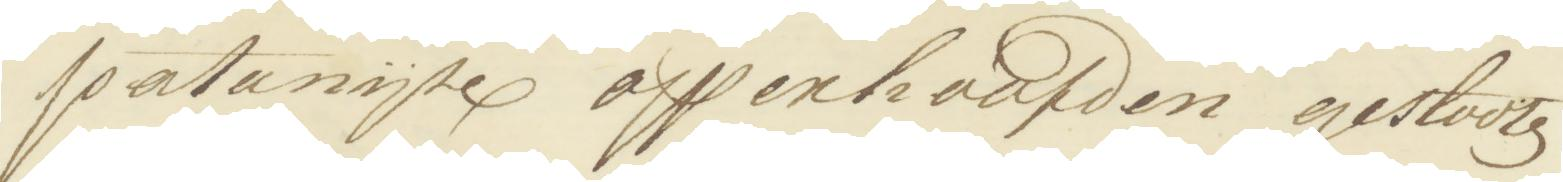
patanijse opperhoofden geslooten
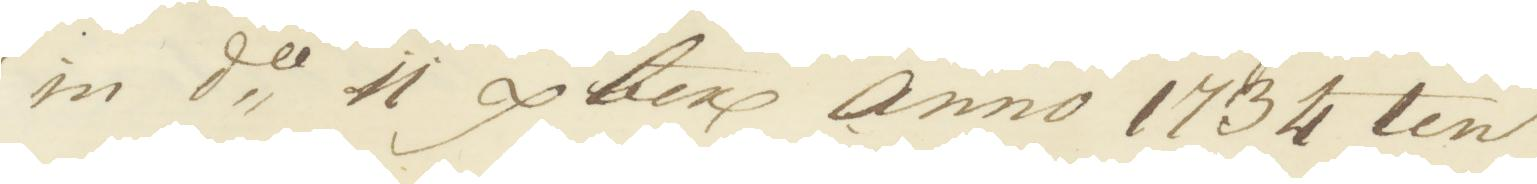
in d„o 11 xber anno 1734 ten
